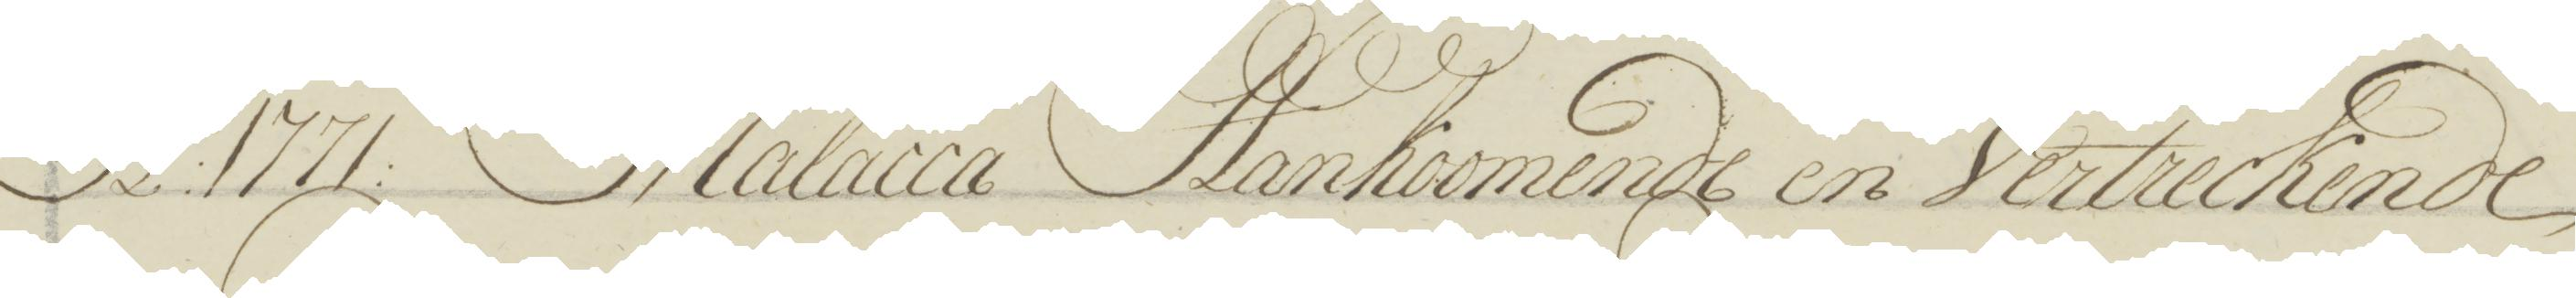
A:o 1771: Malacca Aankoomende en Vertreckende
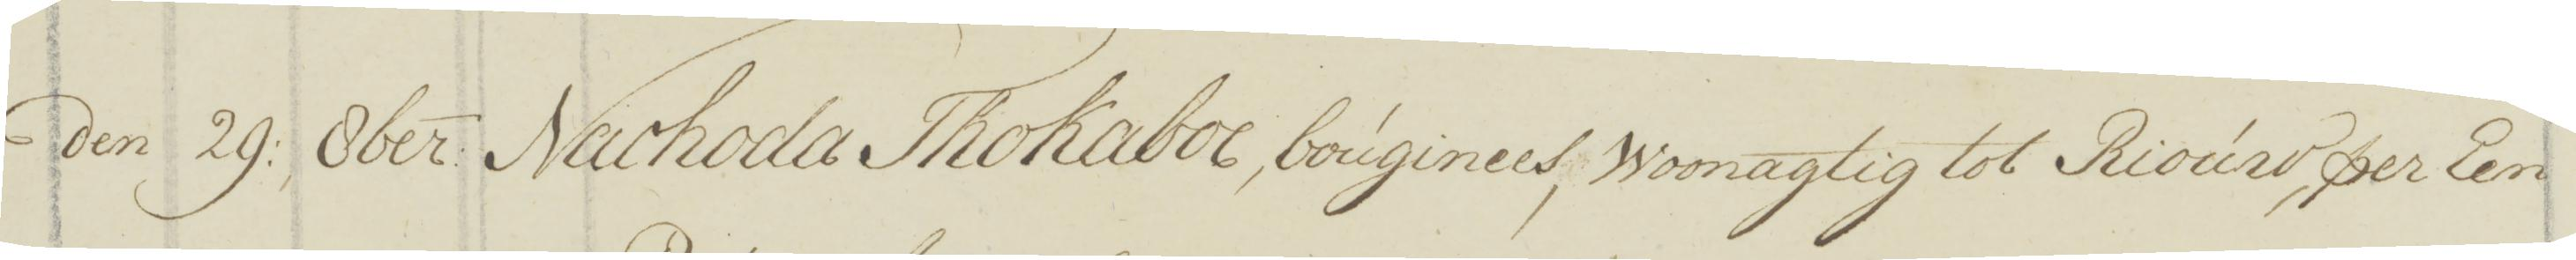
den 29: 8ber: Nachoda Thokaboe, bouginees, woonagtig tot Riouw, per Een
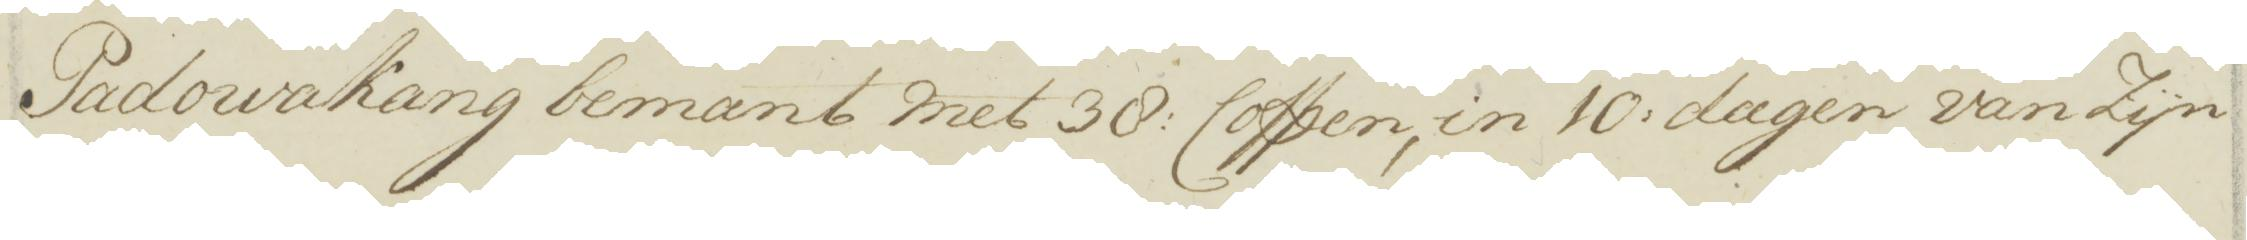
Padowakang bemant met 38: Coppen, in 10: dagen van zijn
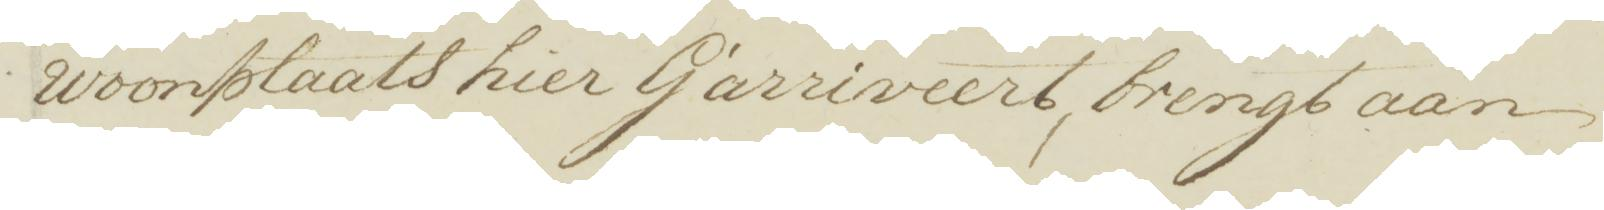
woonplaats hier G'arriveert, brengt aan
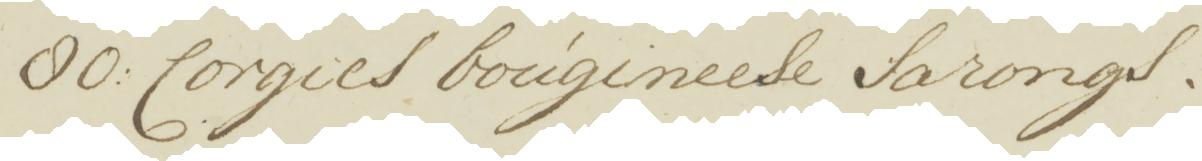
80: Corgies bougineese Sarongs.
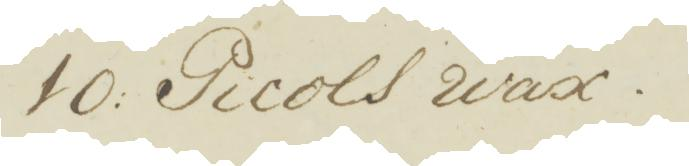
10: Picols wax.
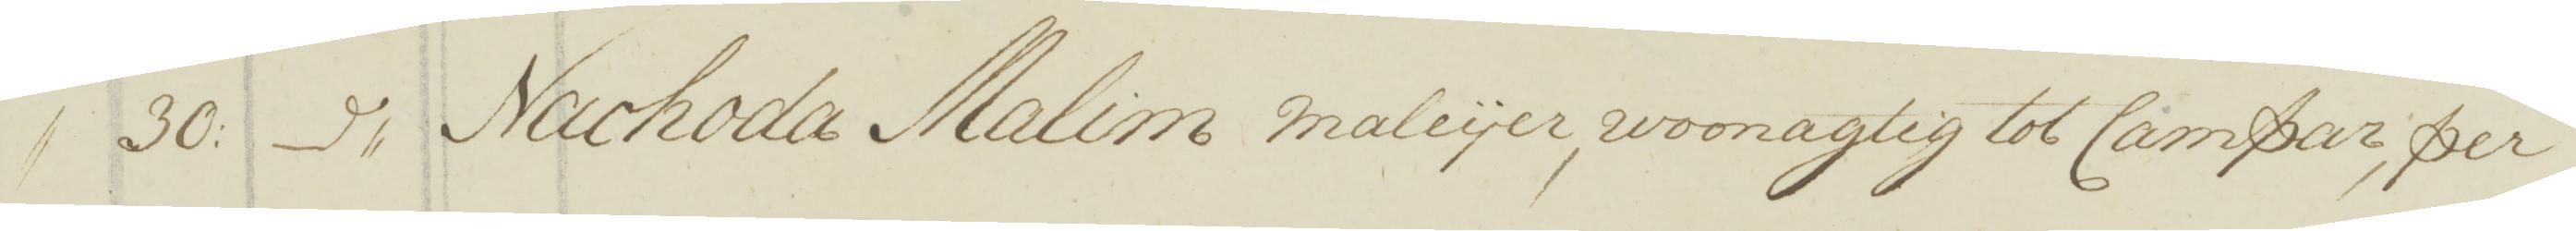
„ 30: _„o Nachoda Malim maleijer, woonagtig tot Campar, per
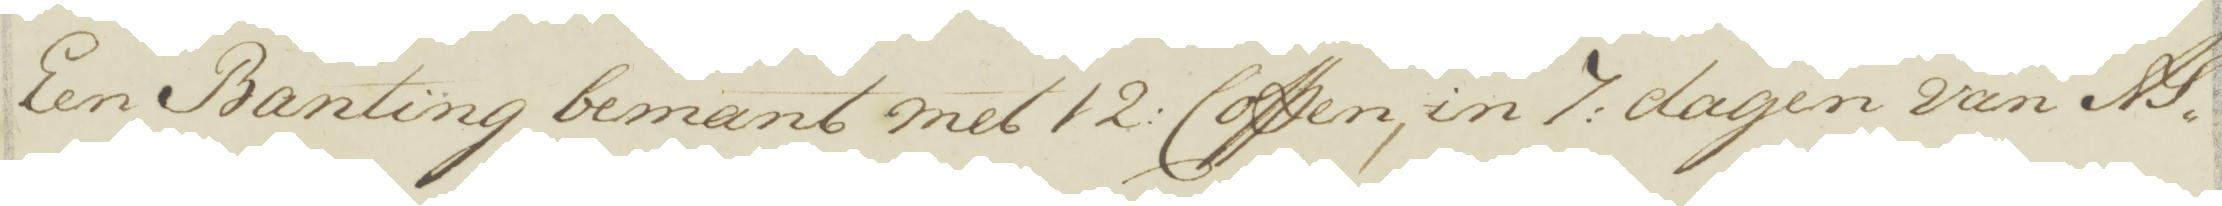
Een Banting bemant met 12: Coppen, in 7: dagen van As„
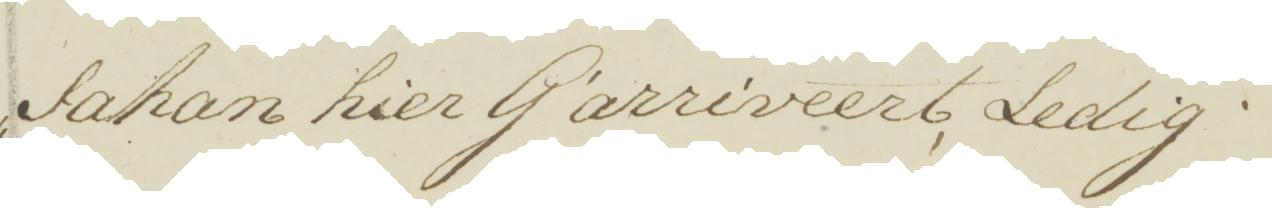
„sahan hier G’arriveert Ledig.
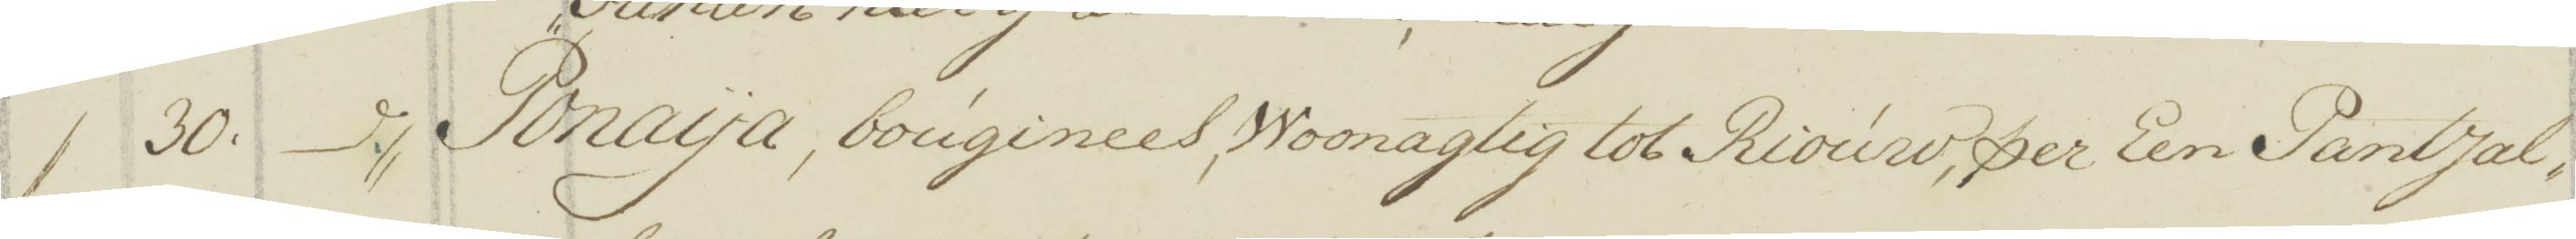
„ 30: _„o Ponaija, bouginees, woonagtig tot Riouw, per Een Pantjal„
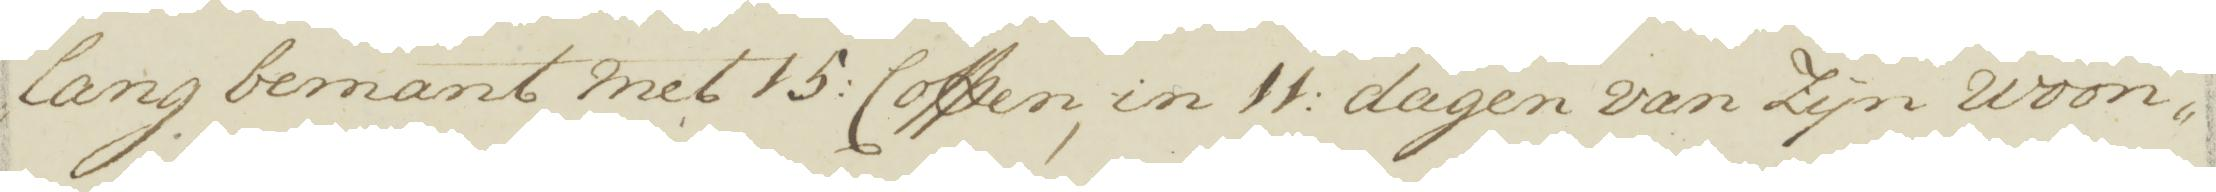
„lang bemant met 15: Coppen, in 11: dagen van zijn woon„
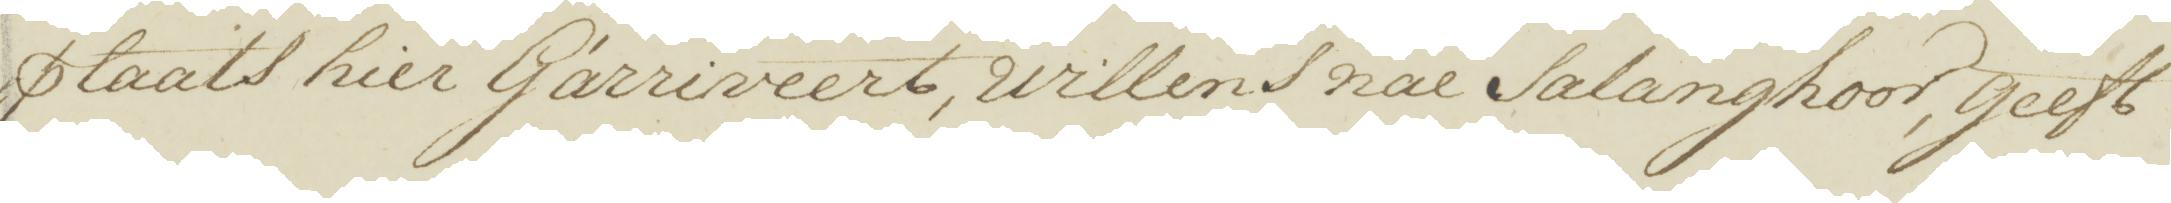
„plaats hier G'arriveert, willens nae salanghoor, geeft
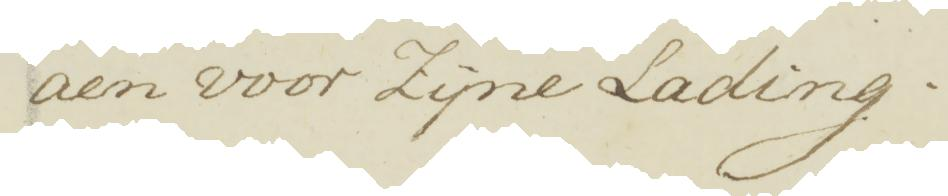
aen voor zijne Lading.
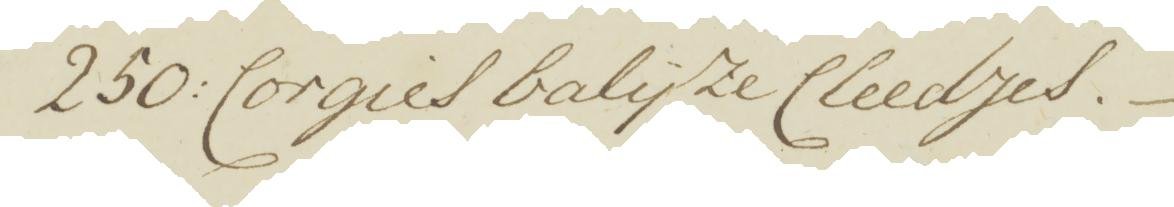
250: Corgies balijze Cleedjes. —
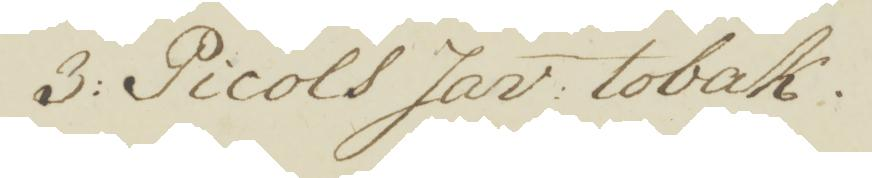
3: Picols Jav: tobak.
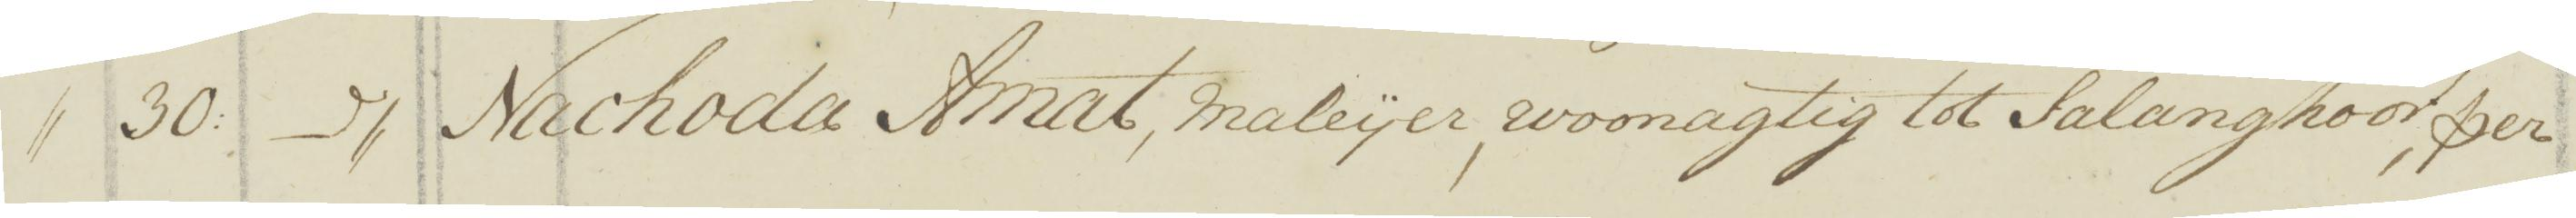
„ 30: _„o Nachoda Amat, maleijer, woonagtig tot salanghoor, per
